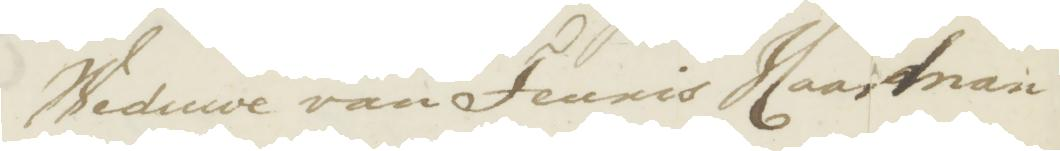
Weduwe van Teunis Haarman
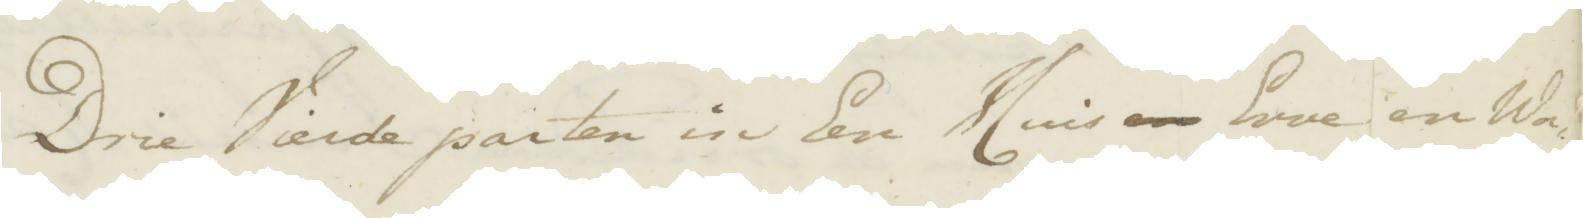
Drie Vierde parten in Een Huis en Erve en Wa„
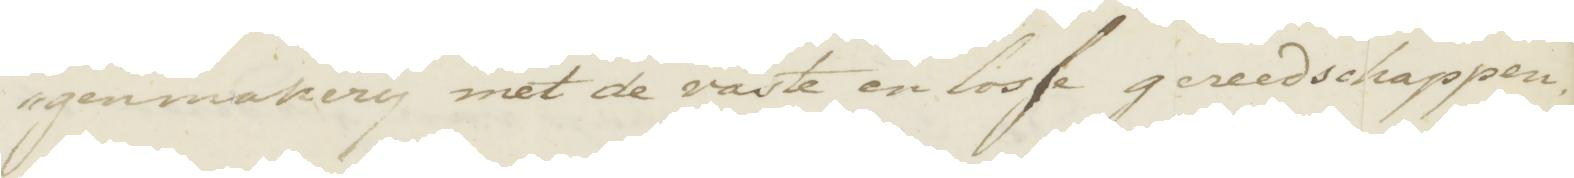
„genmakery met de vaste en losse gereedschappen,
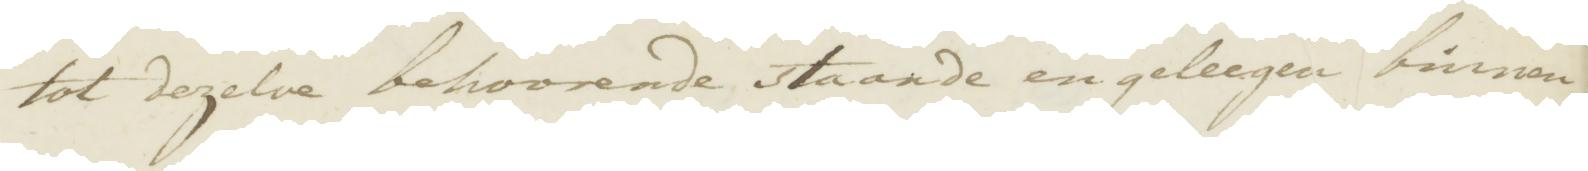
tot dezelve behoorende staande en geleegen binnen
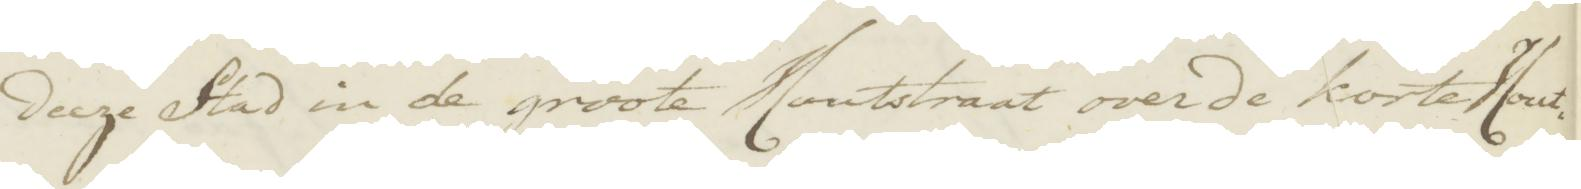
deeze Stad in de groote Houtstraat over de korte Hout„
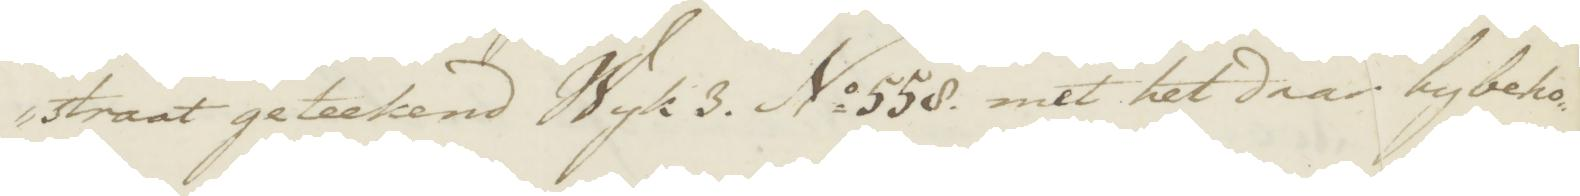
„straat geteekend Wyk 3. N=o 558. met het daar by beho„
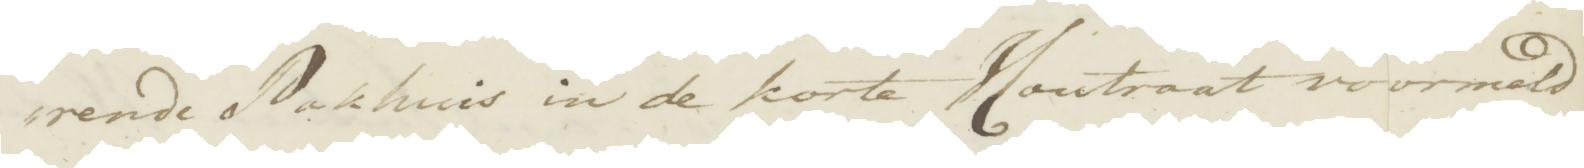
„rende Pakhuis in de korte Houtraat voormeld
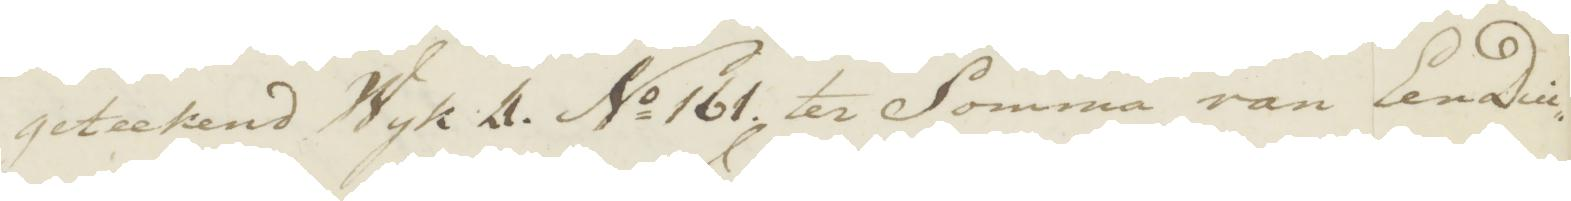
geteekend Wyk 4. N=o 161. ter Somma van Een Dui„
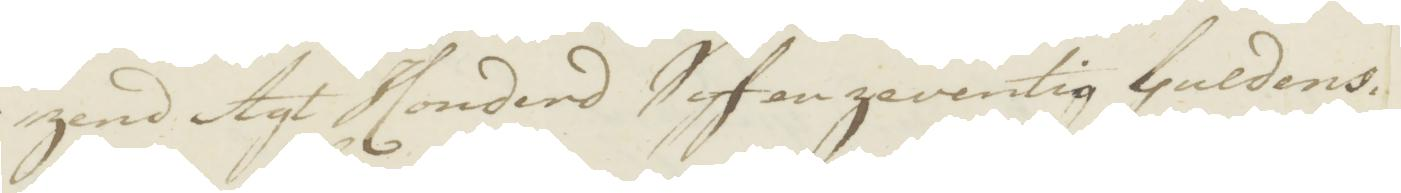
„zend Agt Honderd Vyf en zeventig Guldens.
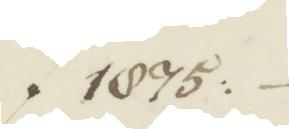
ƒ 1875: —
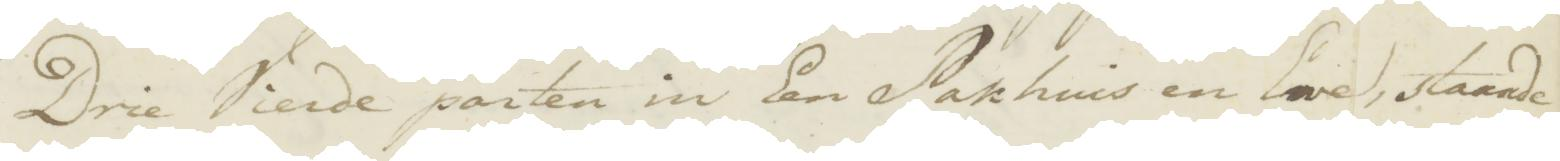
Drie Vierde parten in Een Pakhuis en Erve, staande
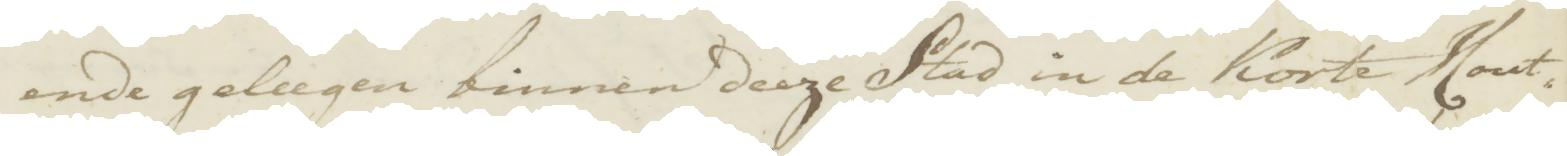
ende geleegen binnen deeze Stad in de Korte Hout„
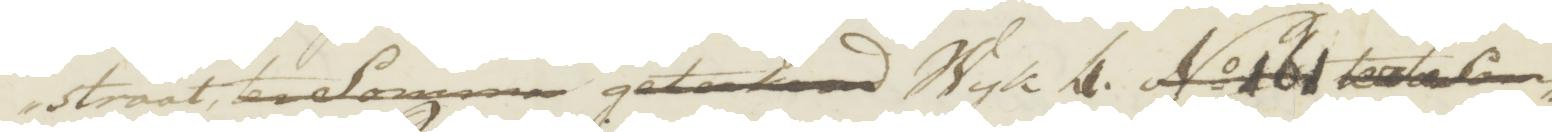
„straat, ter Somma geteekend Wyk 4. N=o 161 ter Som„
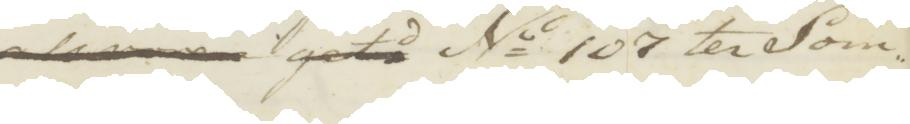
als van get=d N=o 107 ter Som„
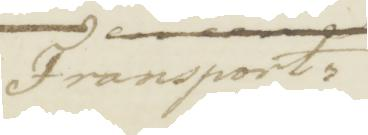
Transport„
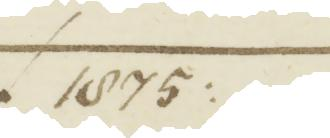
ƒ 1375: —:
